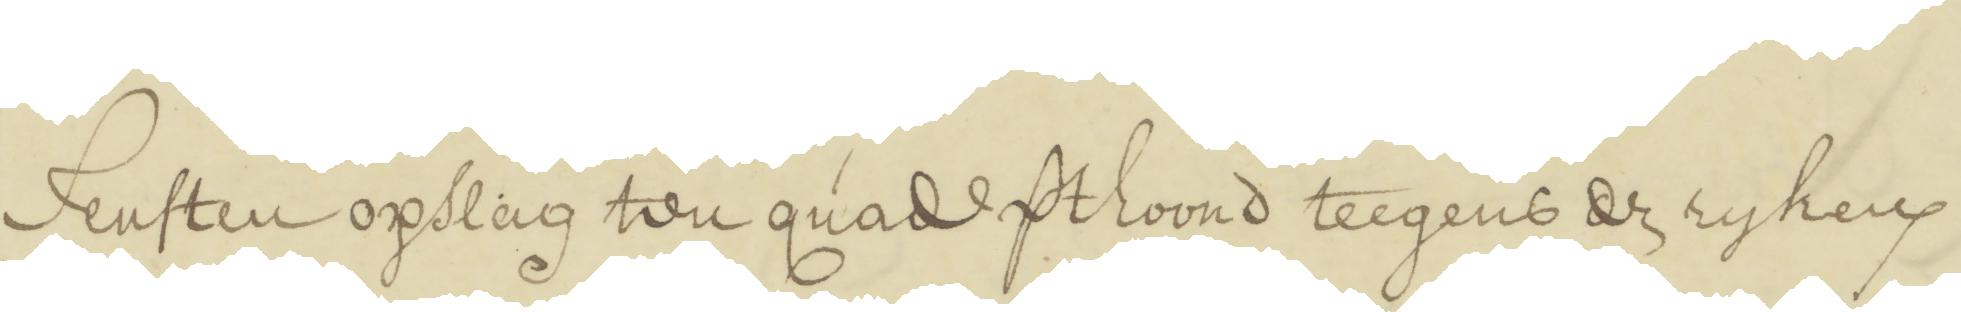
Eersten opslag ten quade verthoond teegens den ryken
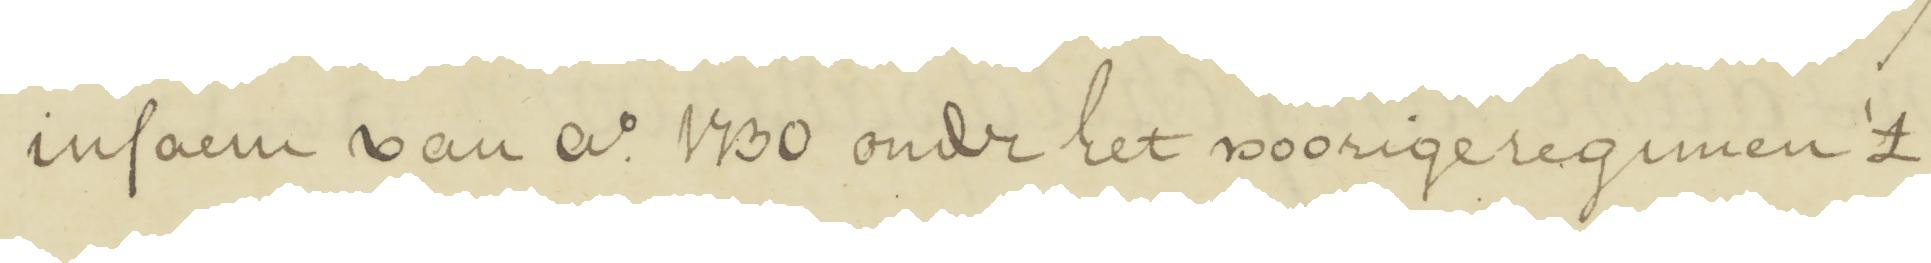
insaem van a.o 1730 onder het voorige regimen ’t
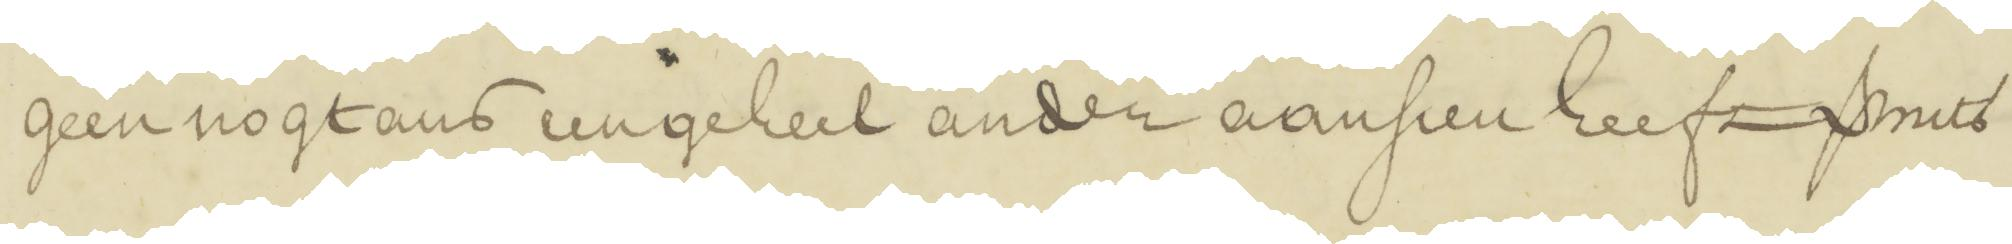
geen nogtans een geheel ander aansien heeft vermits
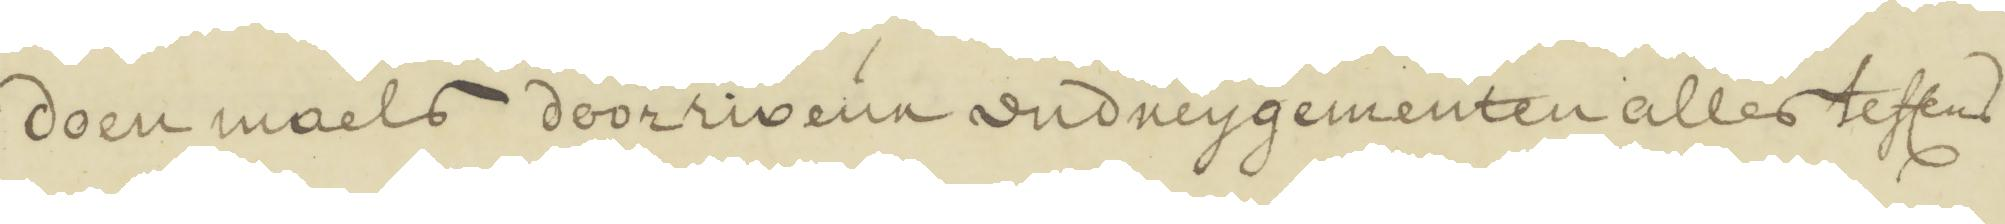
doen maels door riveur endreygementen alles teffens
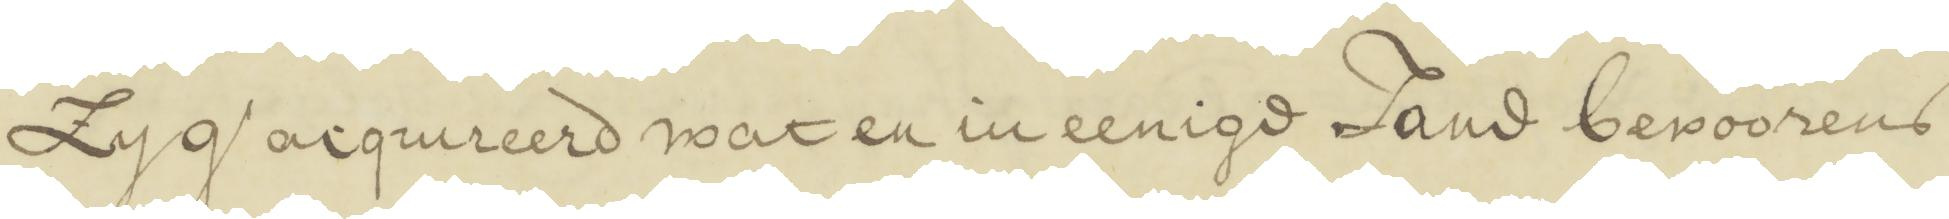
zy g'acquireerd wat er in eenige Iare bevoorens
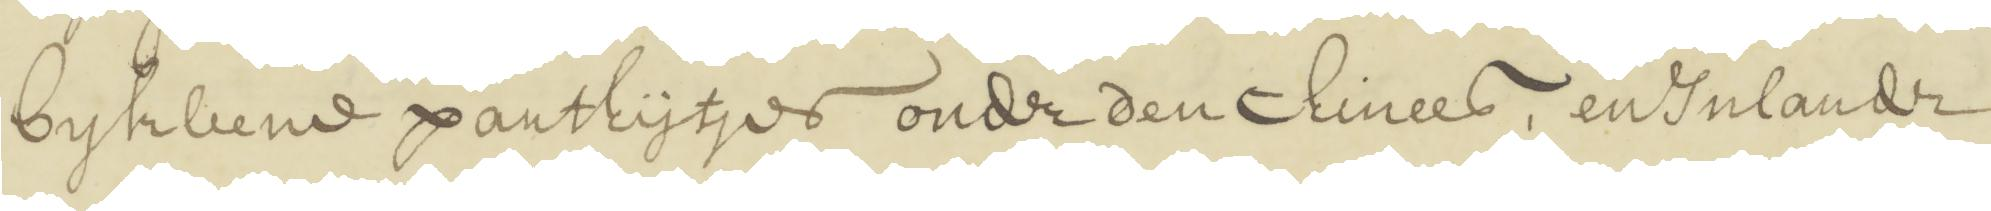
by kleene parthijtjes onder den Chinees, en Inlander
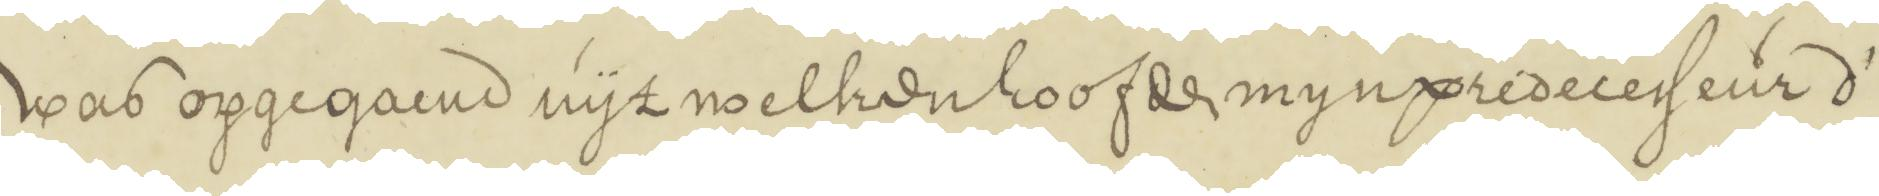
was opgegaerd uijt welken hoof den myn predecesseur d
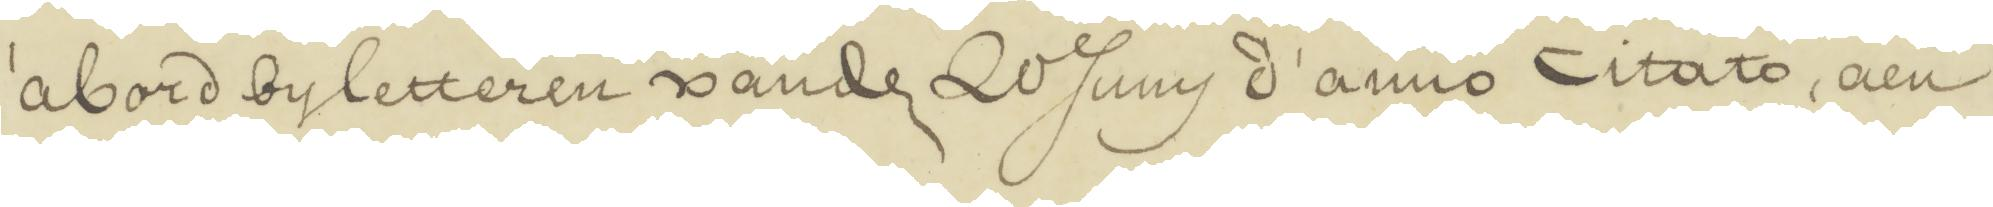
abord by letteren van den 20 Juny d’anno citato, aen
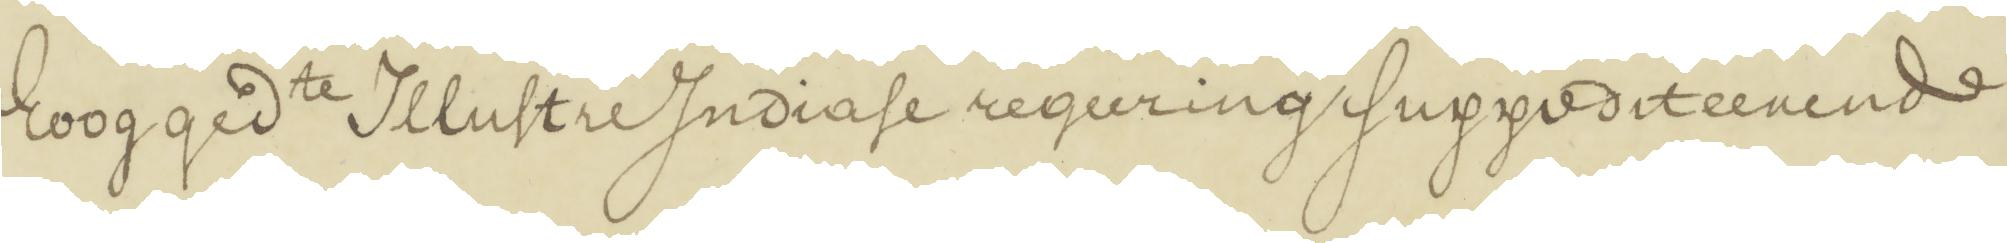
hoog ged:te Illustre Jndiase regeering suppediteerende
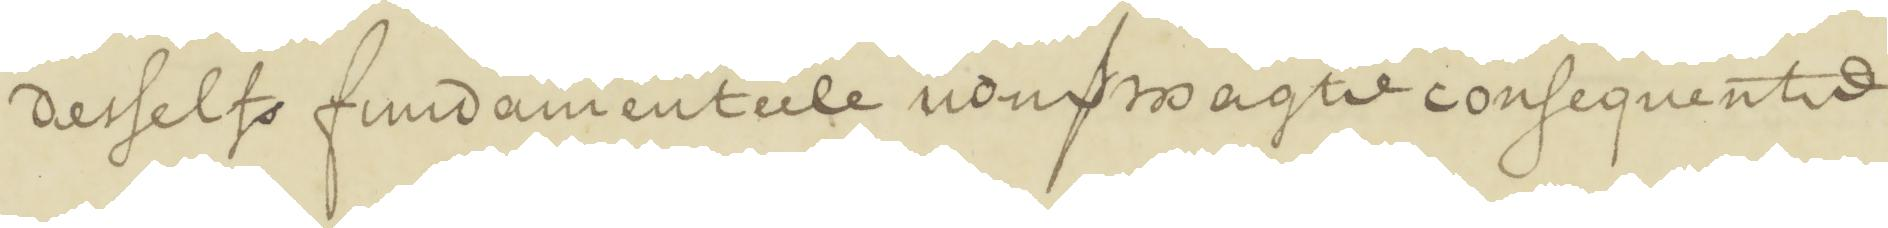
desselfs fundamenteele nonverwagte consequentie
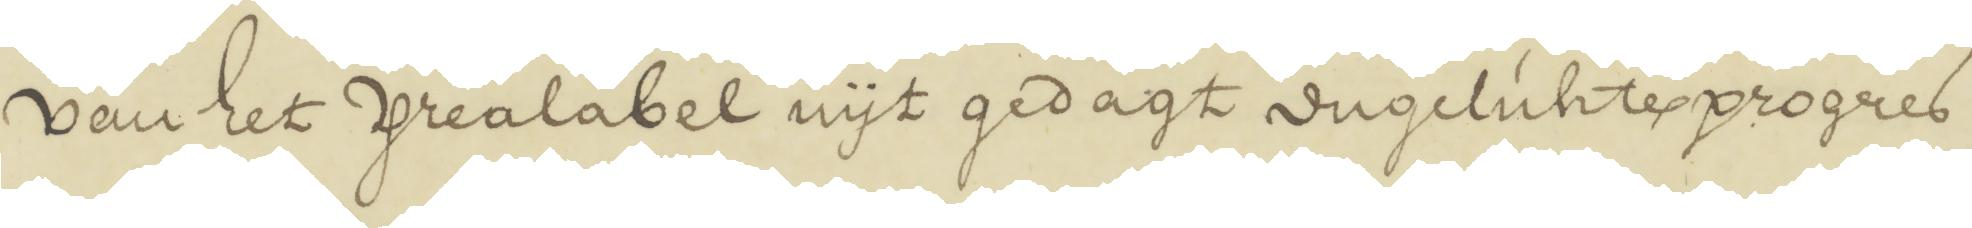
van het prealabel uijt gedagt en gelukte progres
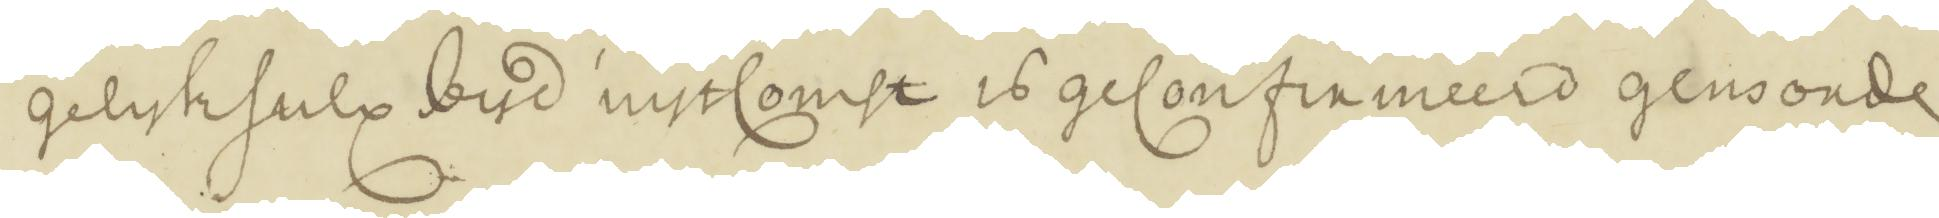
gelyk sulx byd' uytcomst is geconfirmeerd geworden
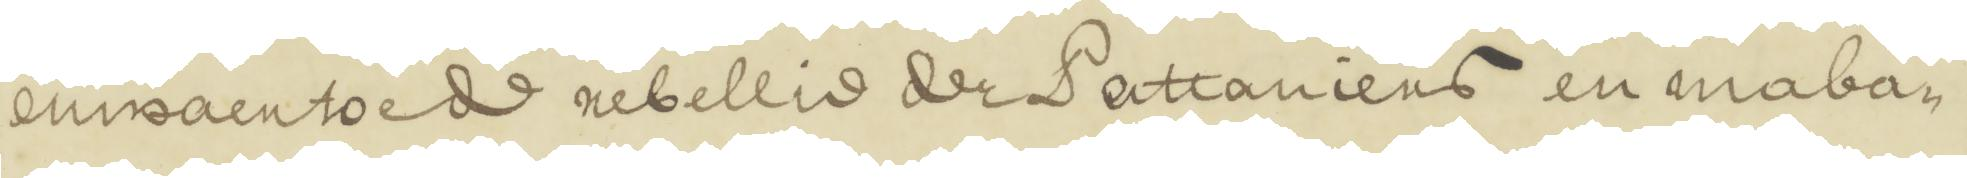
en waer toe de rebellie der Pattaniers en maba„
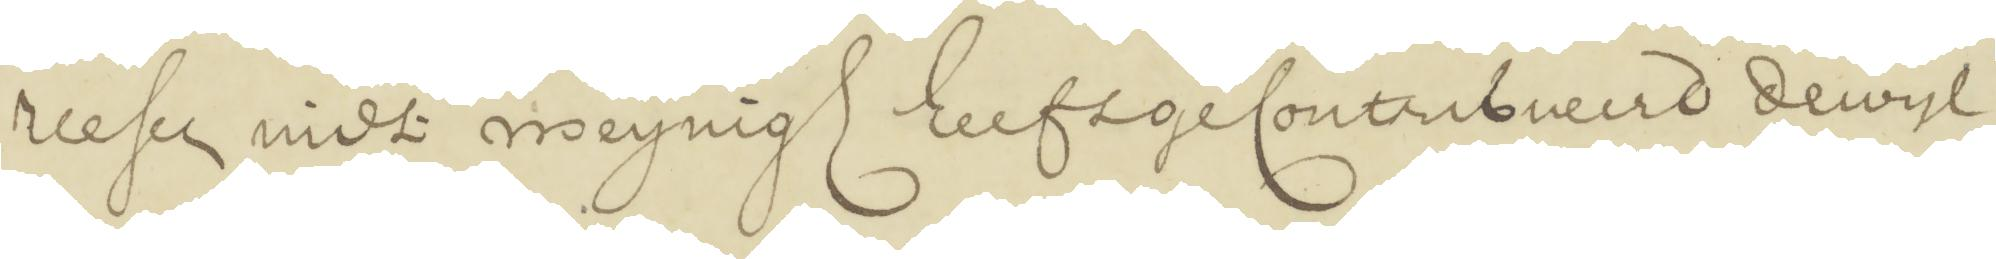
reesen niet weynigh heeft gecontribueerd dewyl
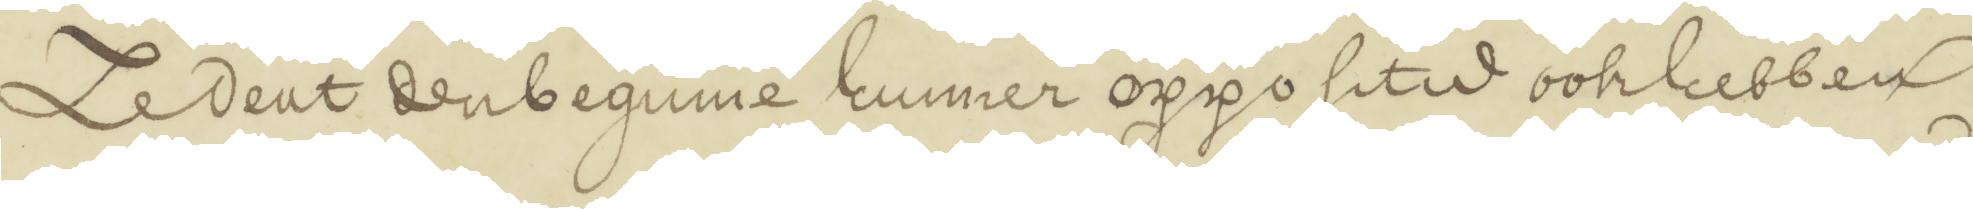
Zedert den beginne hunner oppositie ook hebben
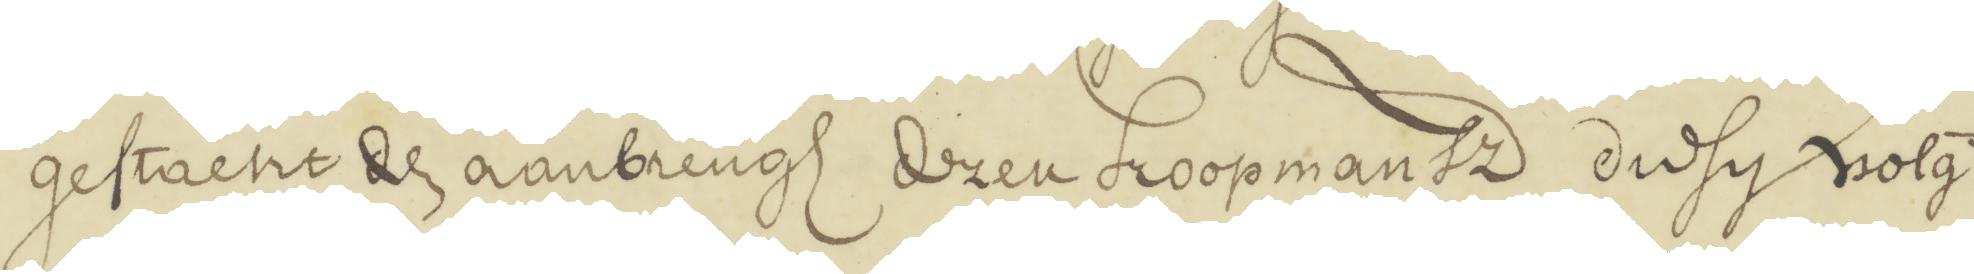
gestaekt den aanbrengh dezer koopmansz diesy volgs
